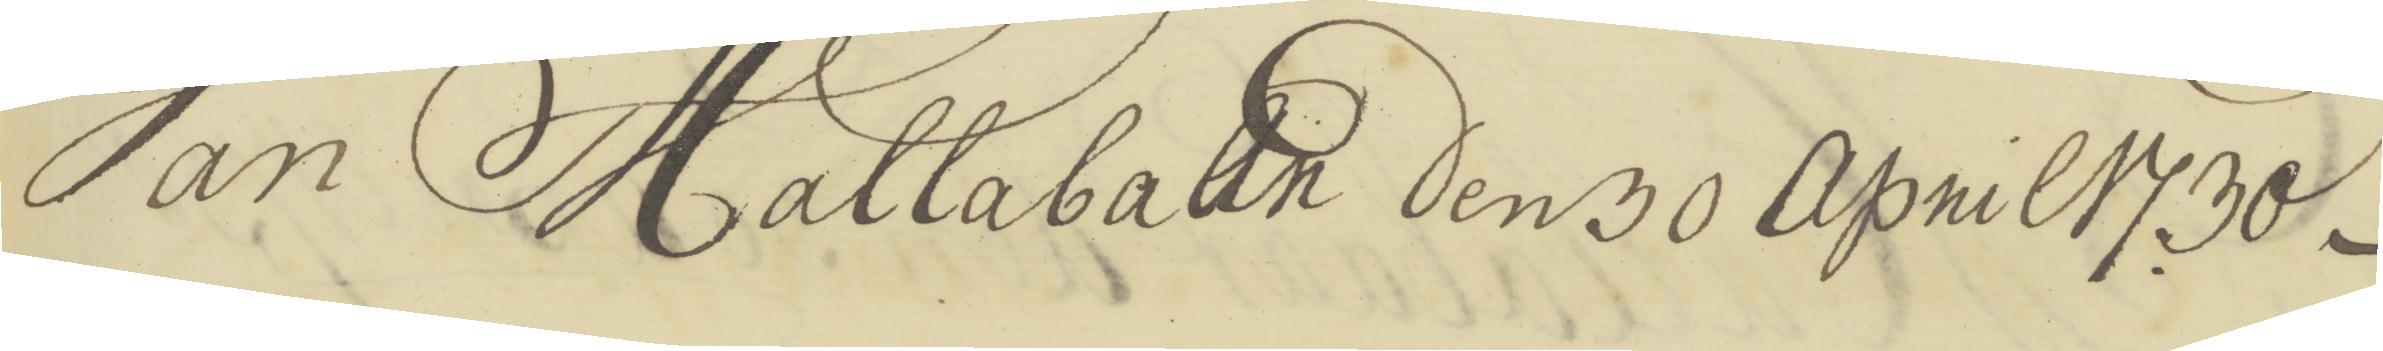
Van Mallabaar den 30 April 1730
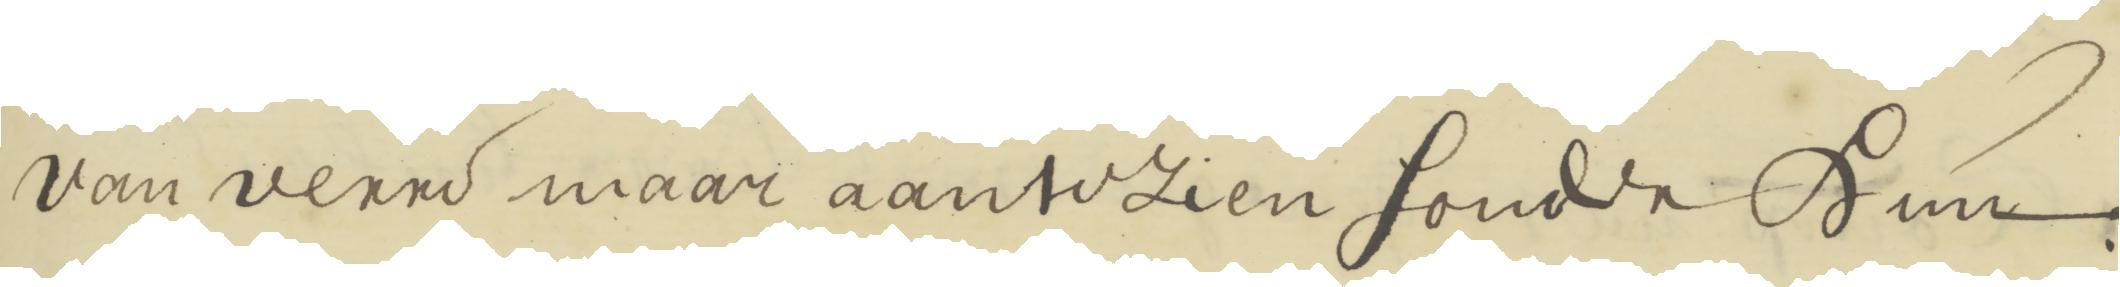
van verre maar aan te zien sonder hun
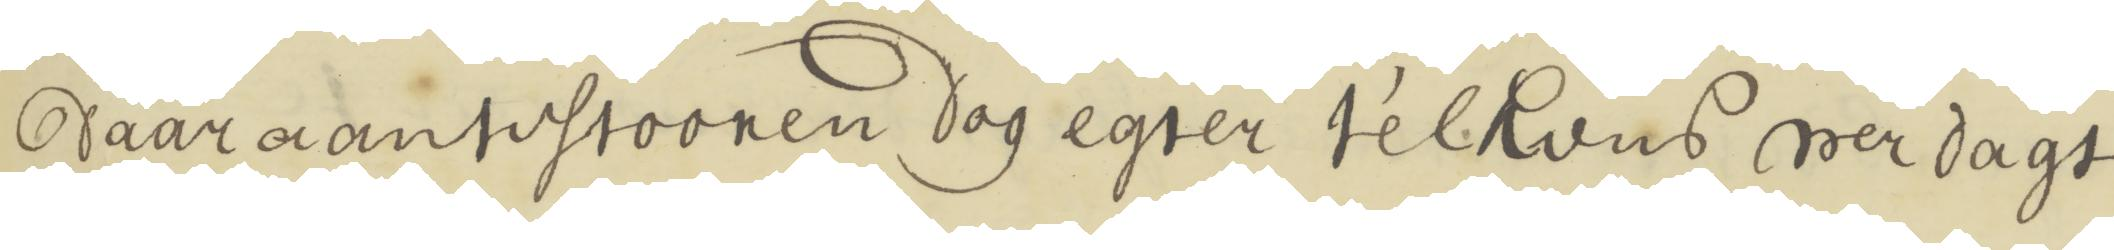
daar aantestooren dog egter telkens verdagt
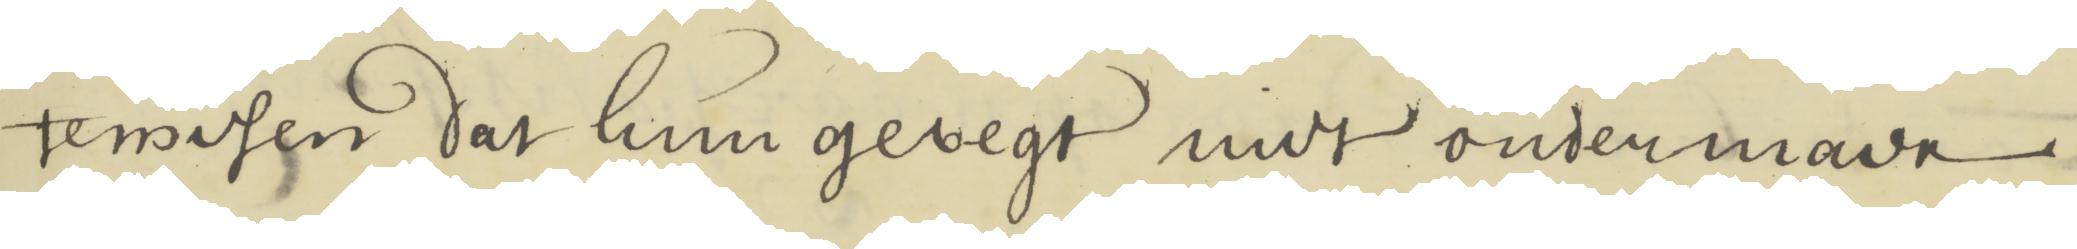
te wesen dat hun gevegt niet onder maer
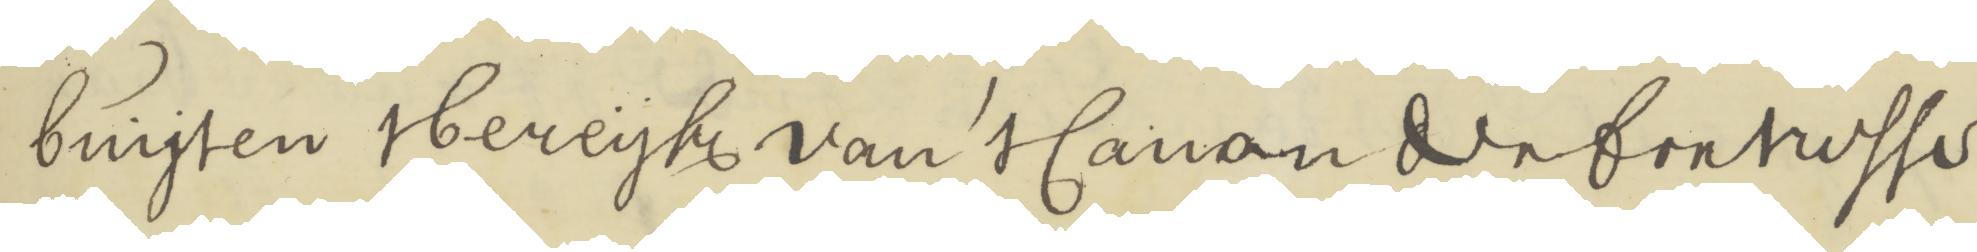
buijten tbereijk van ’tCanon der fortresse
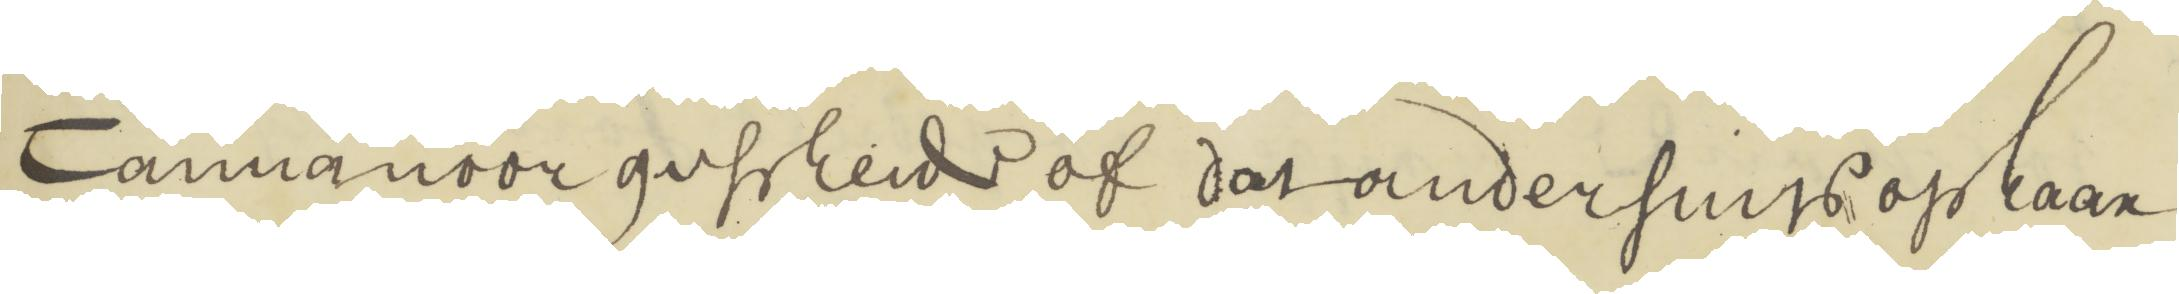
Cannanoor gescheide of dat andersints op haar
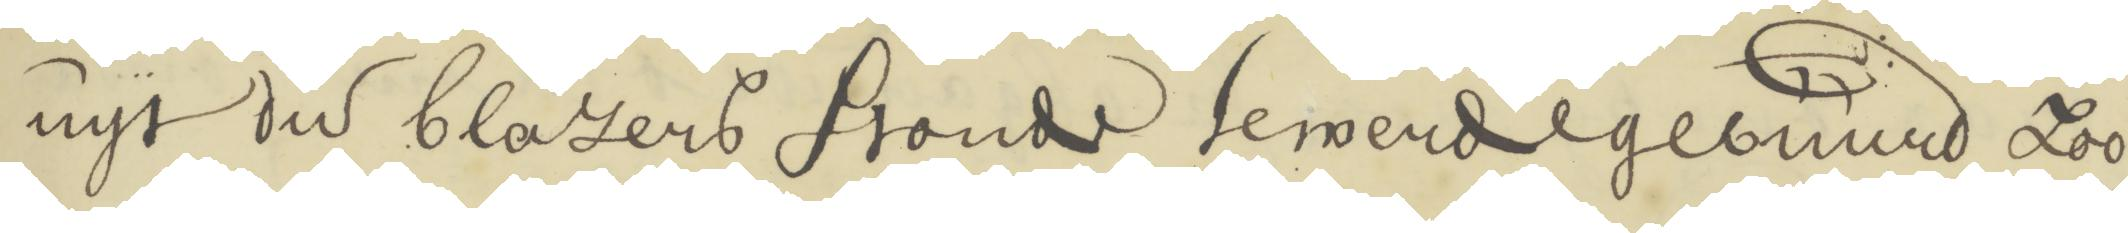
uijt die blazers stonde te werde gevuurd zoo
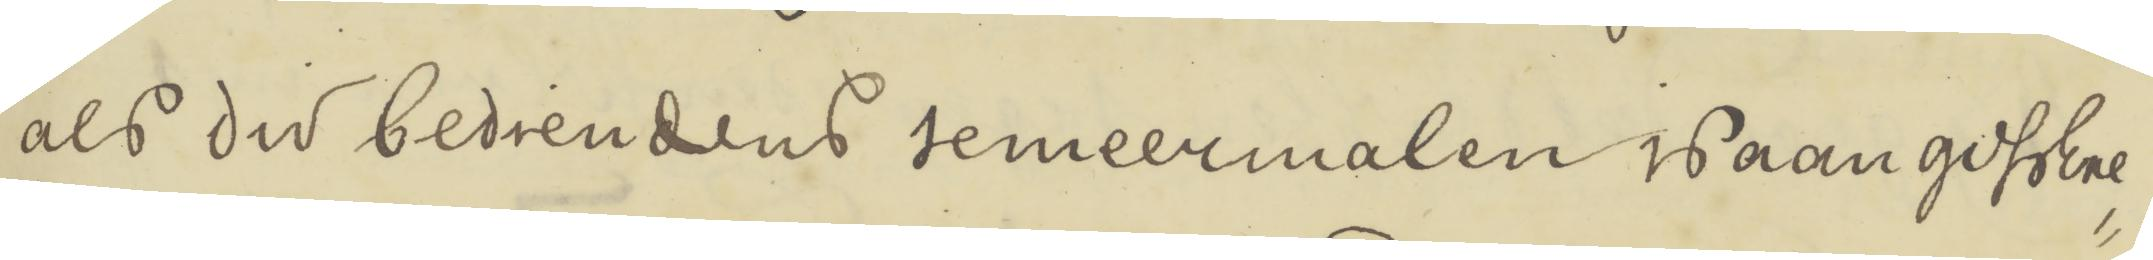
als die bediendens te meermalen is aan geschre„
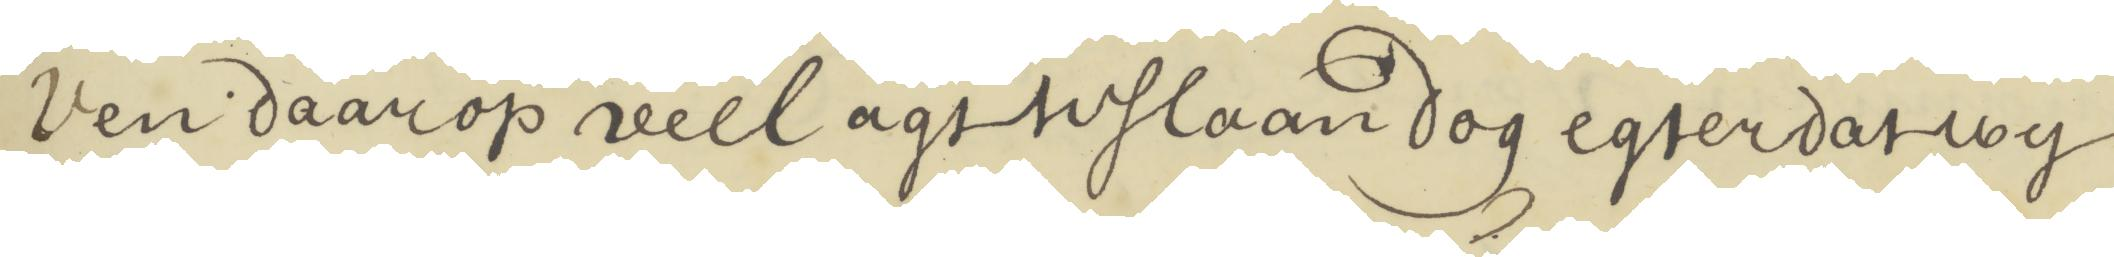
ven daar op veel agt teslaan dog egter dat wij
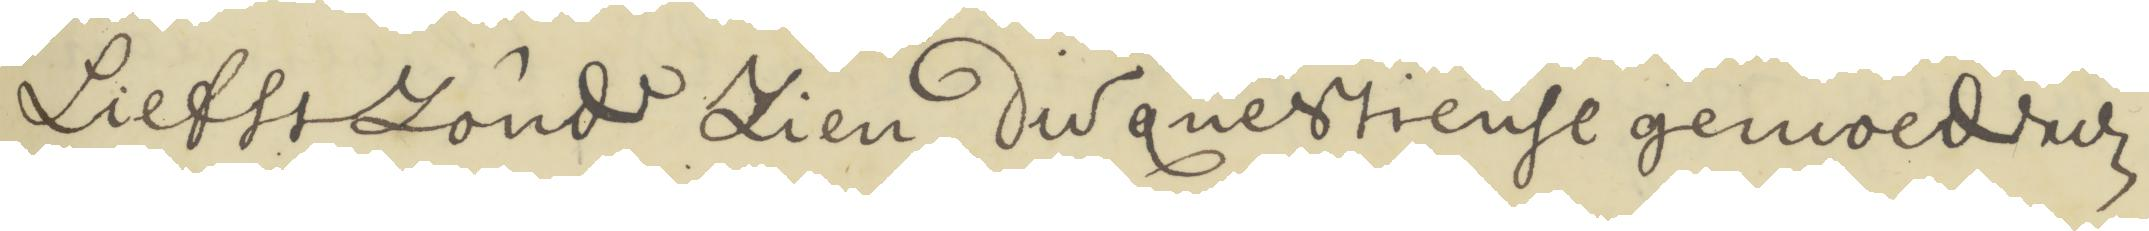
Liefst zoude zien die questieuse gemoederen
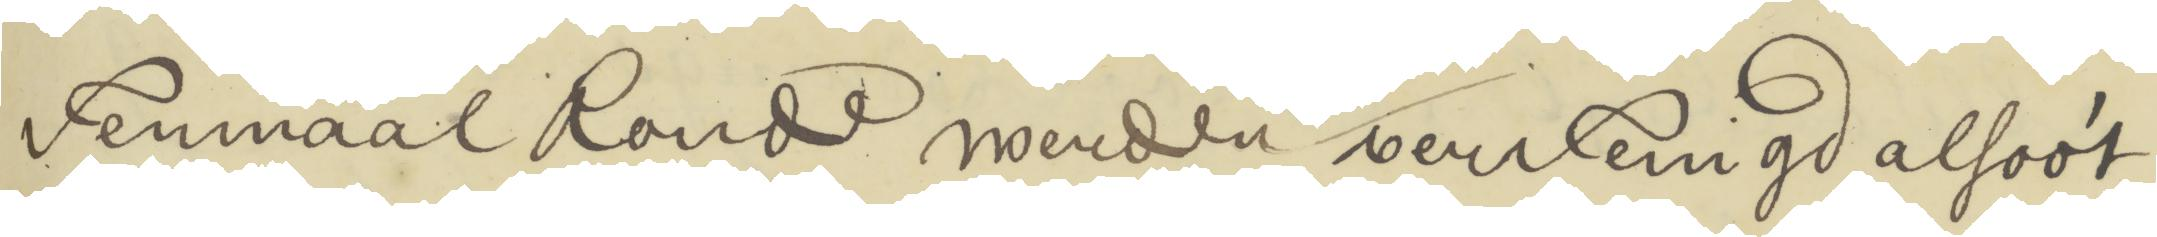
Eenmaal konde werden verEenigd alsoo't
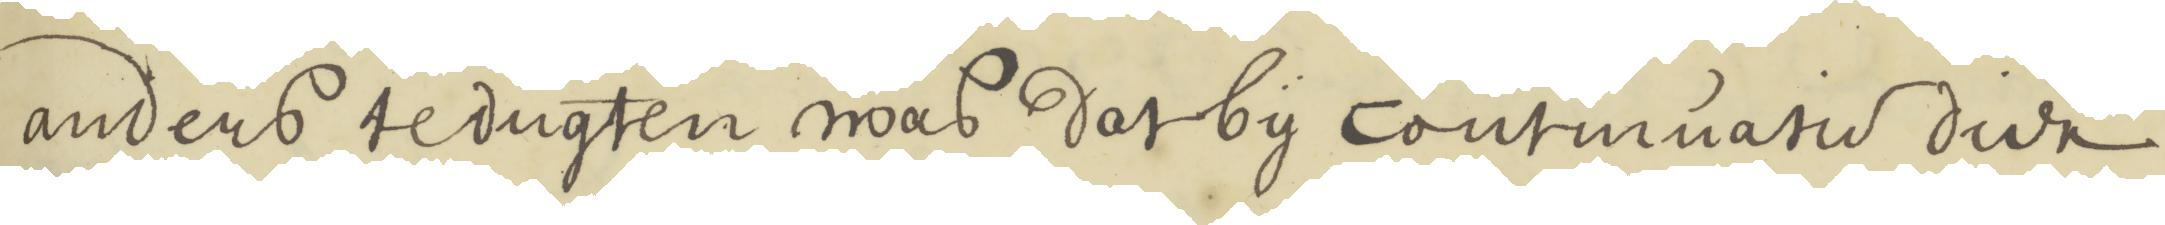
anders te dugten was dat bij continuatie dier
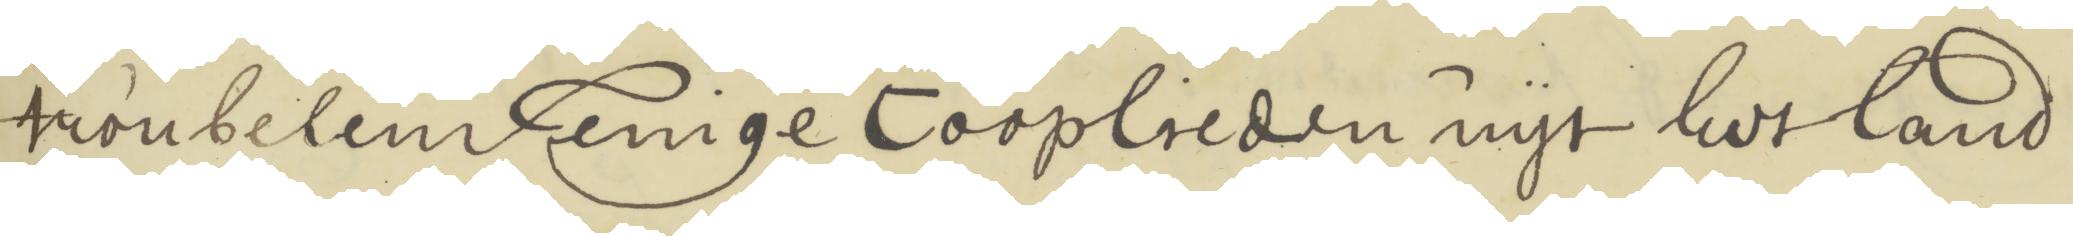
troubelen Eenige Cooplieden uijt het land
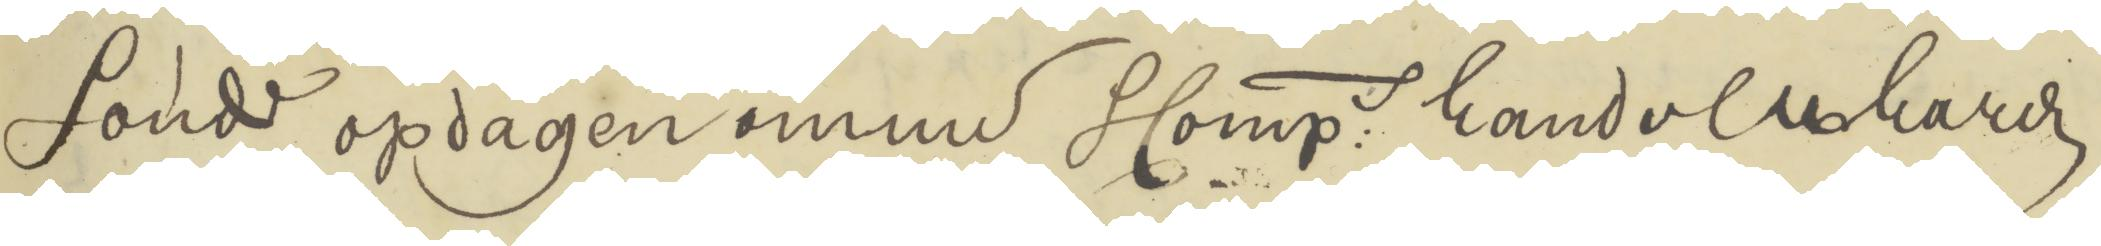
soude opdagen omme sComp:s handelwharen
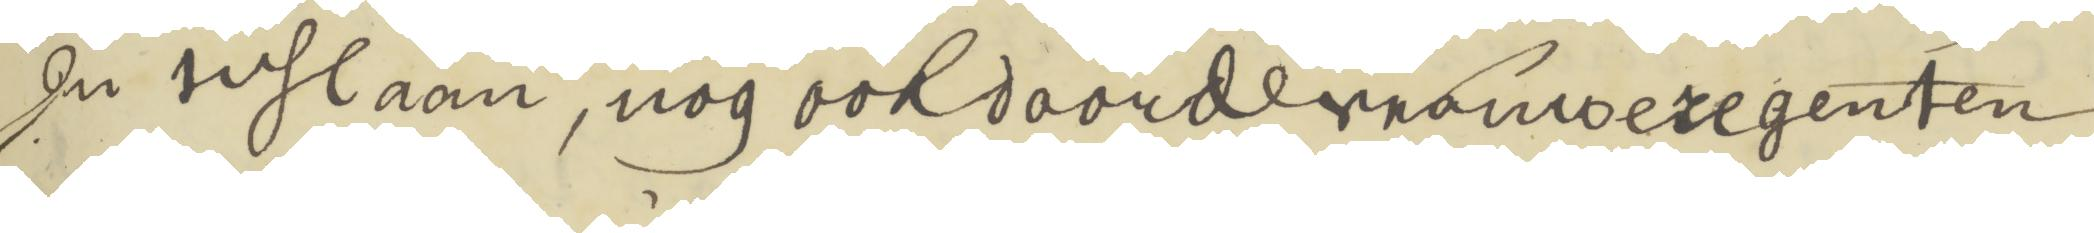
jn teslaan, nog ook door de vrouwe regenten
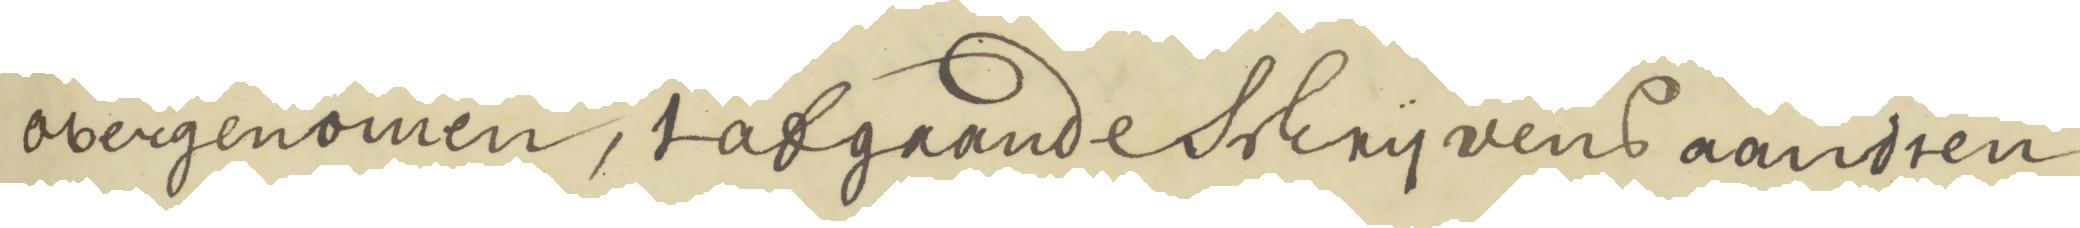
overgenomen, 't afgaande schrijvens aandien
